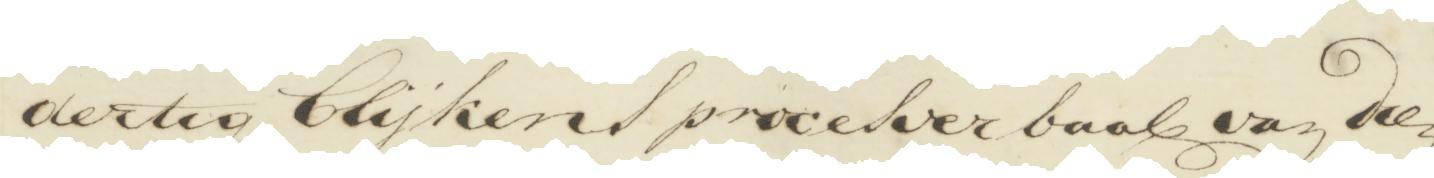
dertig, blijkens procesverbaal van dien
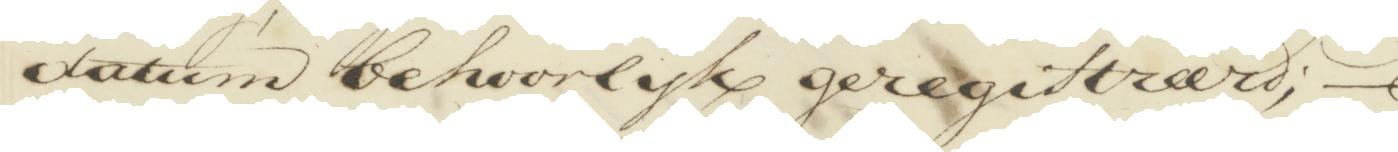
datum behoorlyk geregistreerd; —
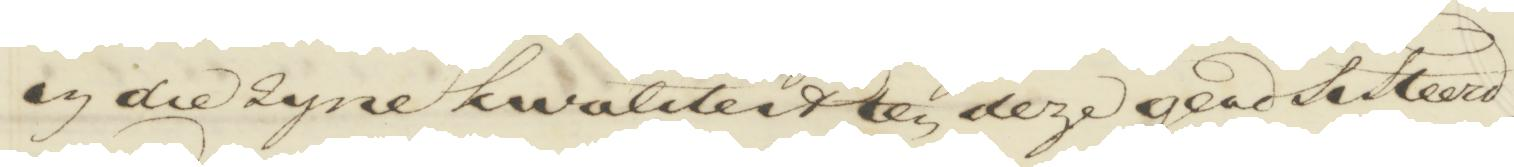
en die zyne kwaliteit ten deze geadsisteerd
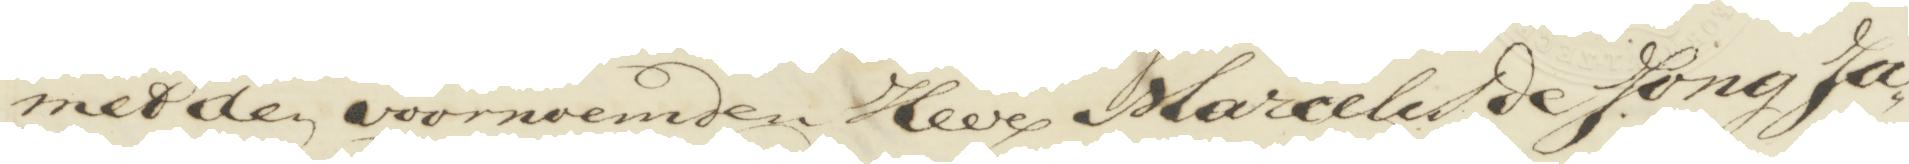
met den voornoemden Heer Marcelis de Jong Ja„
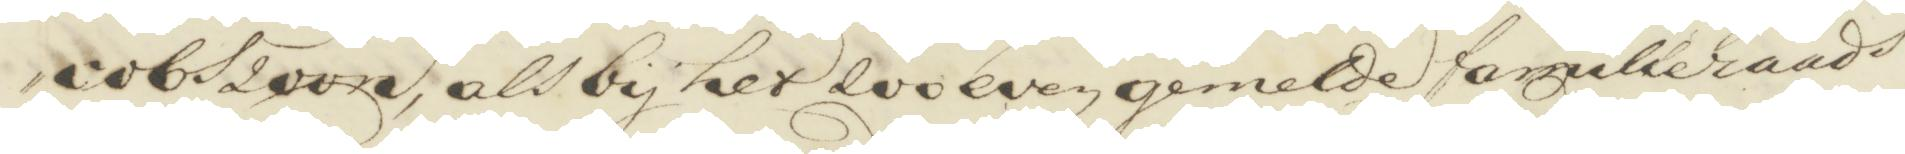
„cobs zoon, als bij het zoo even gemelde familleraads
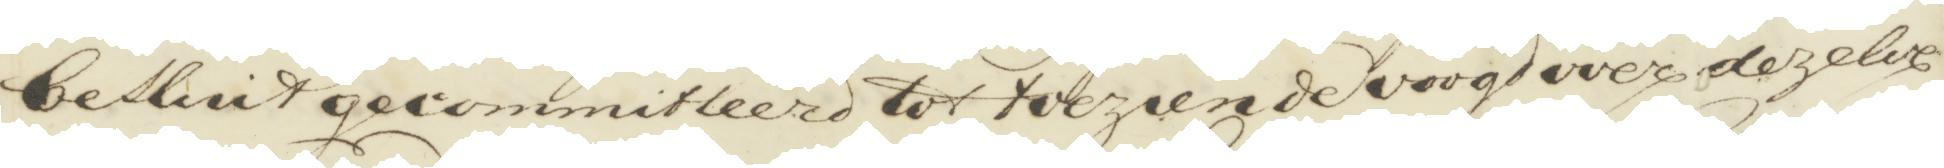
besluit gecommitteerd tot toeziende voogd over, dezelve
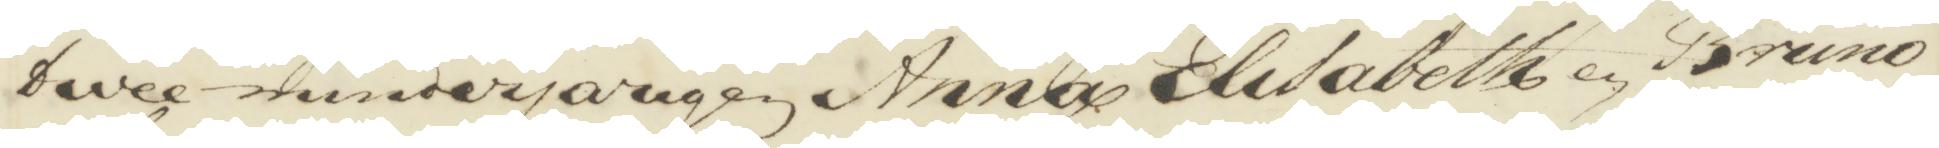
twee minderjarigen Anna Elisabeth en Bruno
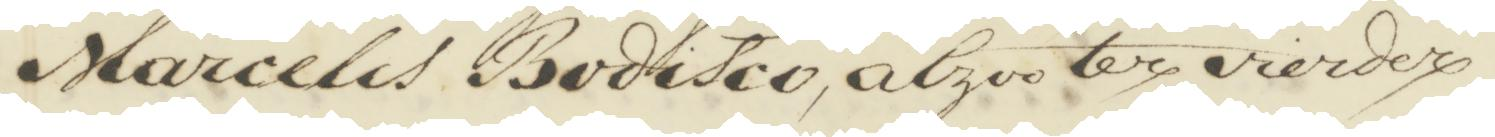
Marcelis Bodisco, alzoo ter vierder
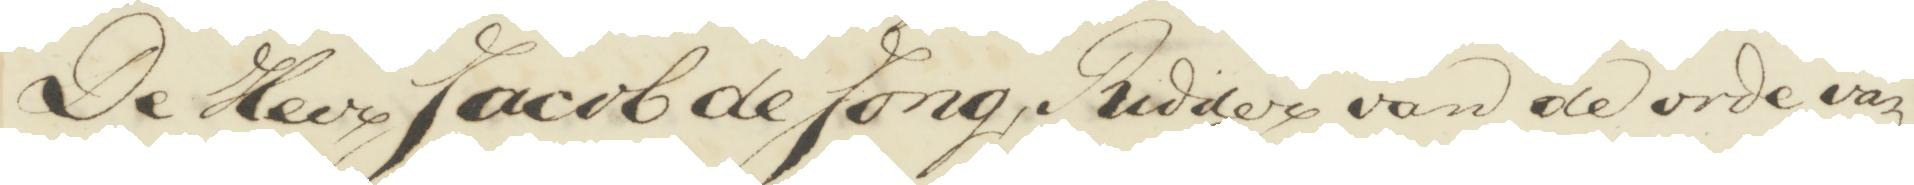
De Heer Jacob de Jong, Ridder van de orde van
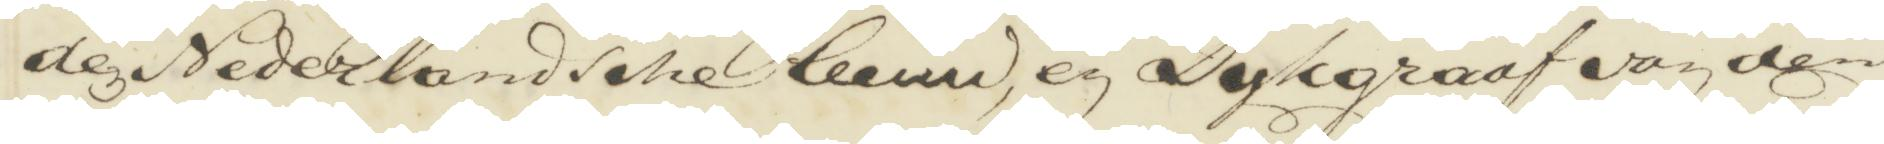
den Nederlandsche leeuw, en Dykgraaf van den
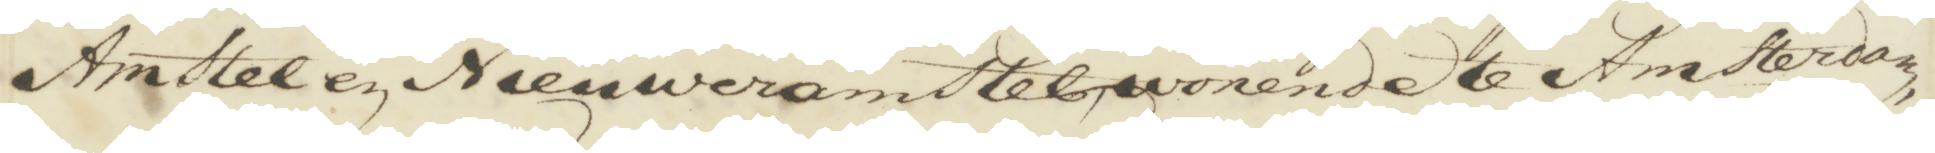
Amstel en Nieuweramstel, wonende te Amsterdam,
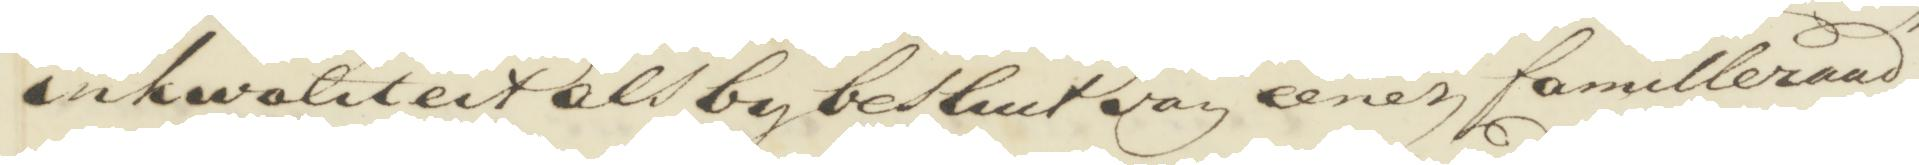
in kwaliteit als by besluit van eenen familleraad,
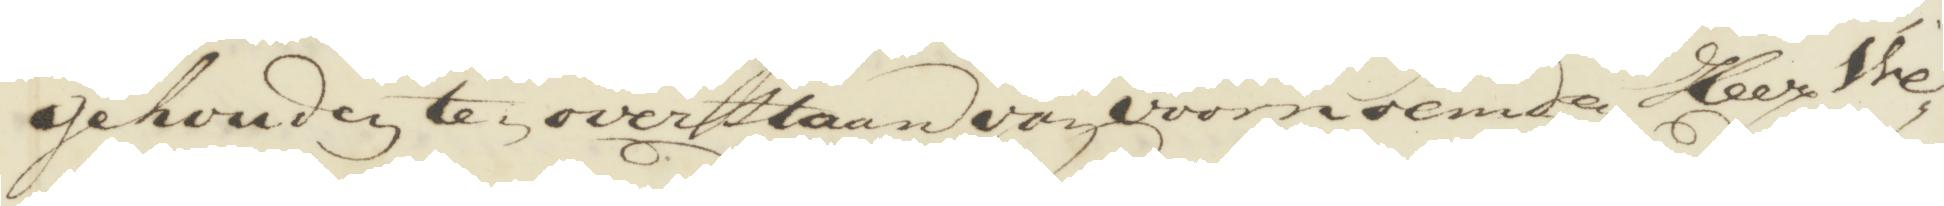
gehouden ten overstaan van voornoemden Heer Vre„
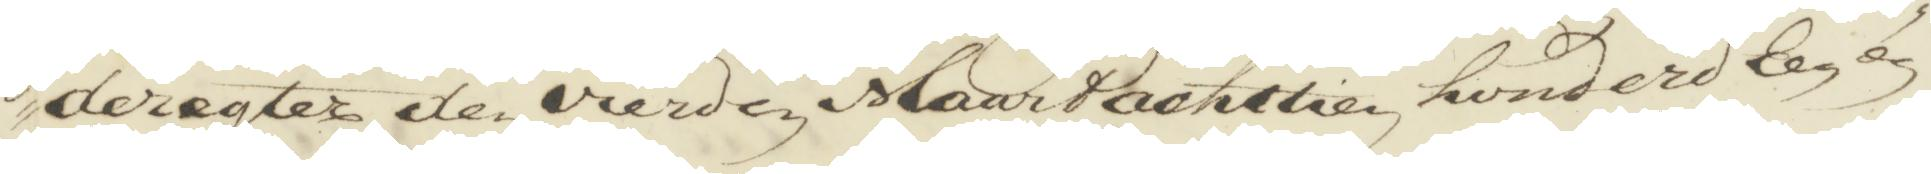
„deregter den vierden Maart achttien honderd Een en
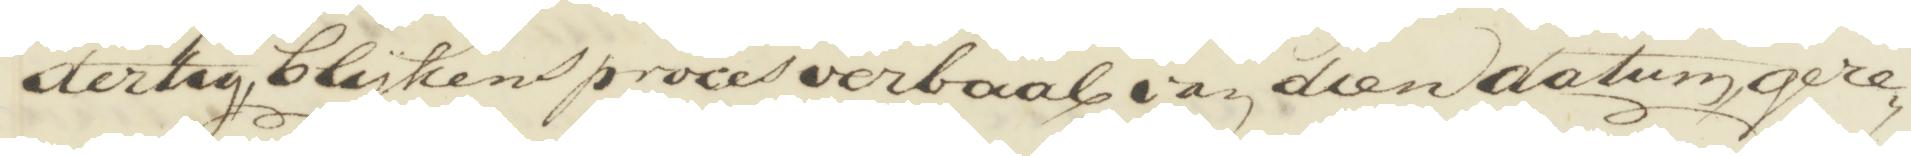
dertig, blijkens proces verbaal van dien datum, gere„
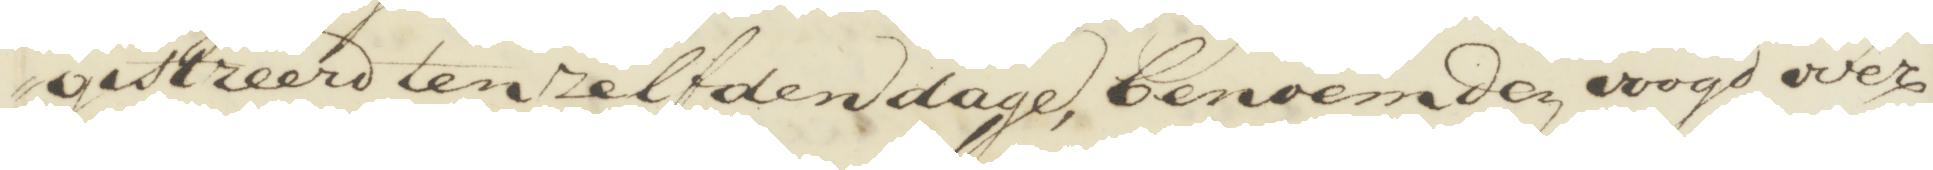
„gistreerd ten zelfden dage, benoemden voogd over
